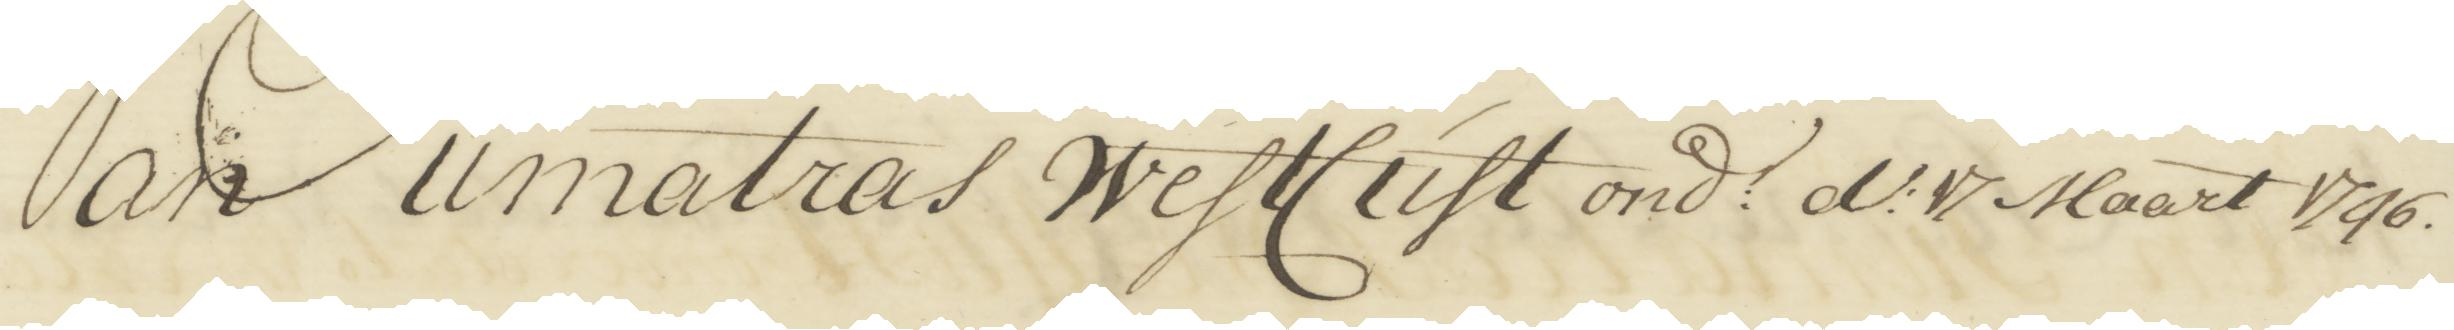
Van Sumatras west cust ond:r d:o 17 Maart 1746.
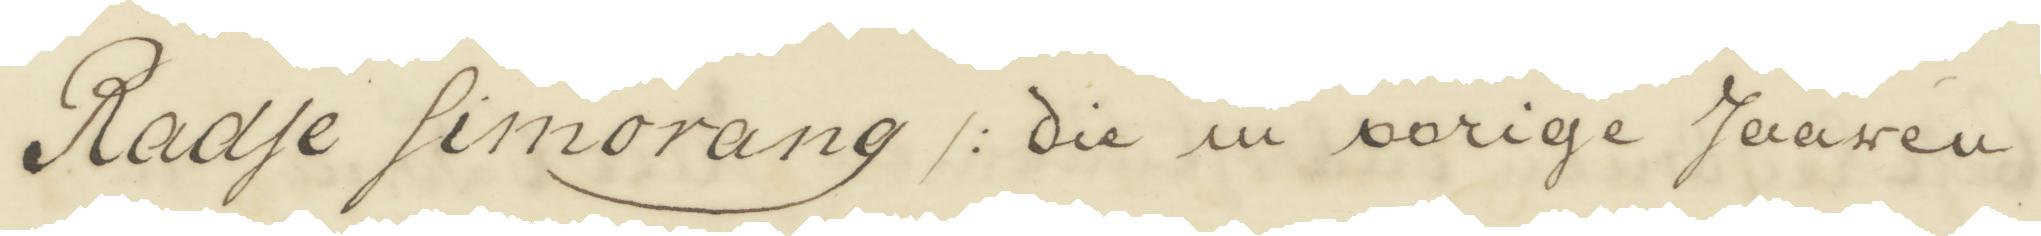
Radje Simorang /: die in vorige Jaaren
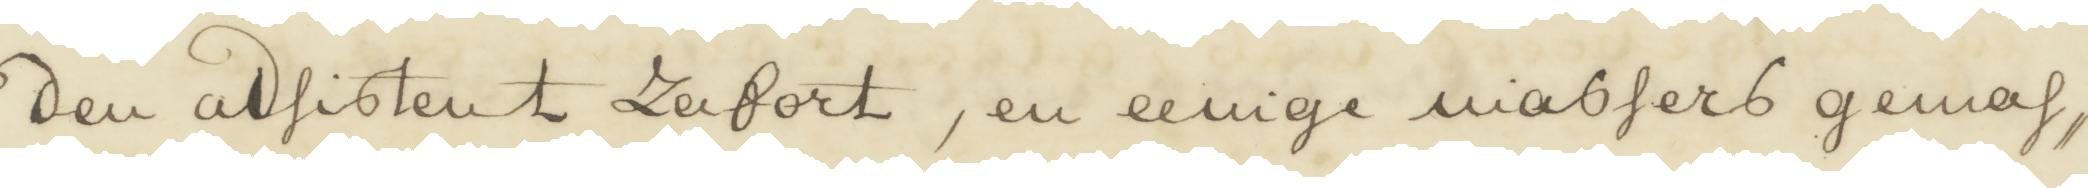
den adsistent zafort , en eenige niassers gemas„
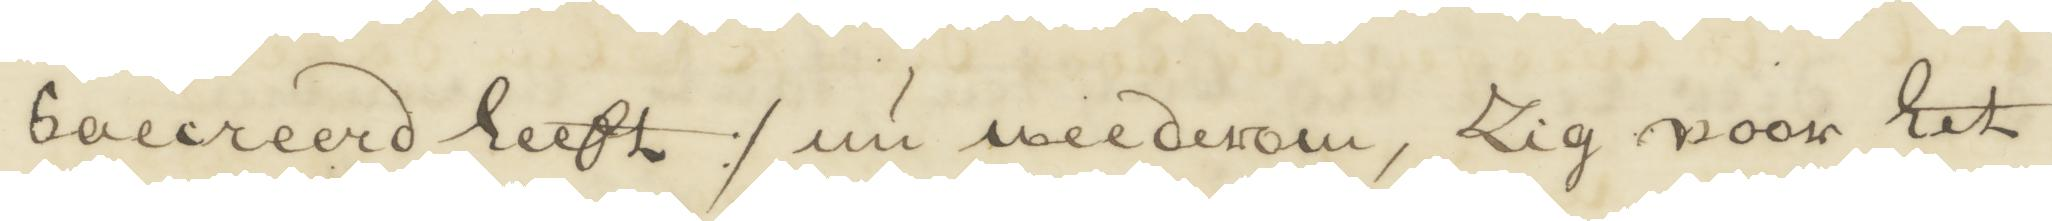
saecreerd heeft:/ nu weederom, zig voor het
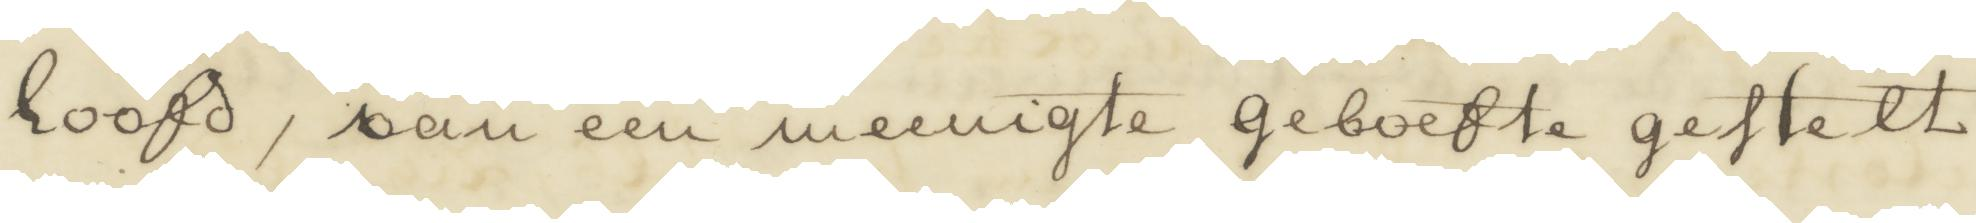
hoofd, van een meenigte geboefte gestelt
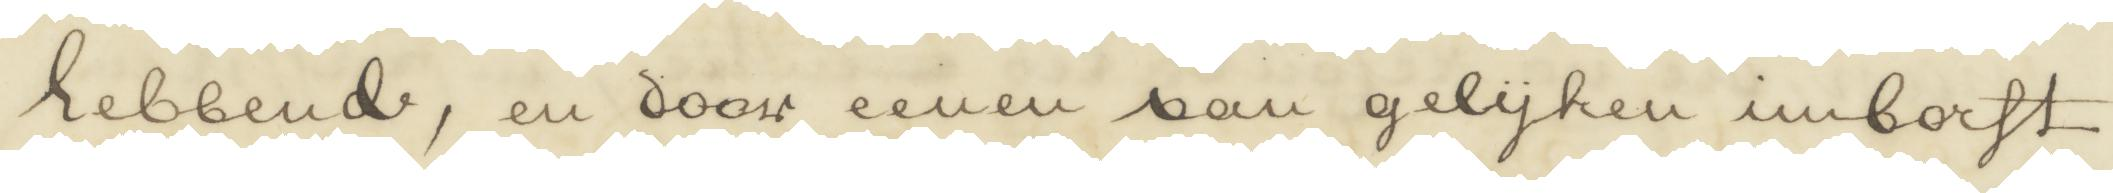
hebbende, en door eenen van gelijken imborst
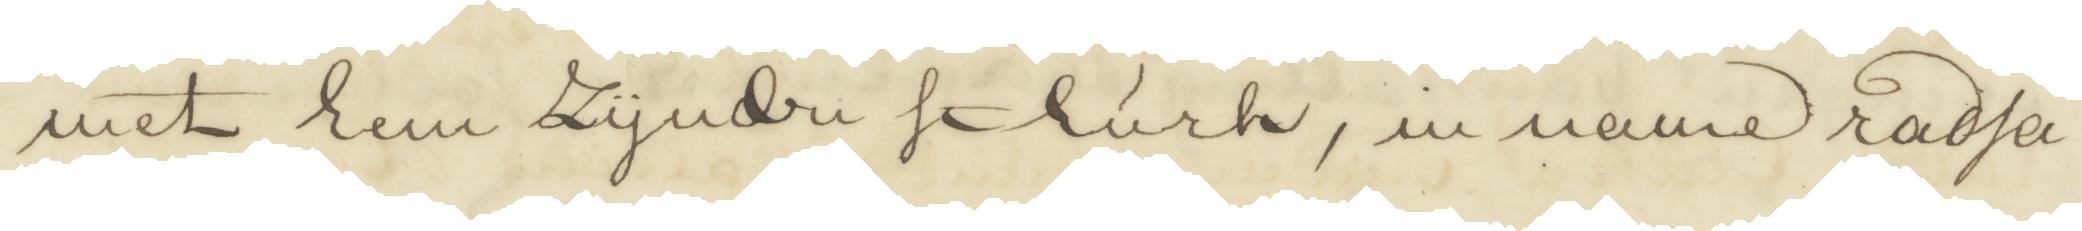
met hem zijnden schurk, in name radja
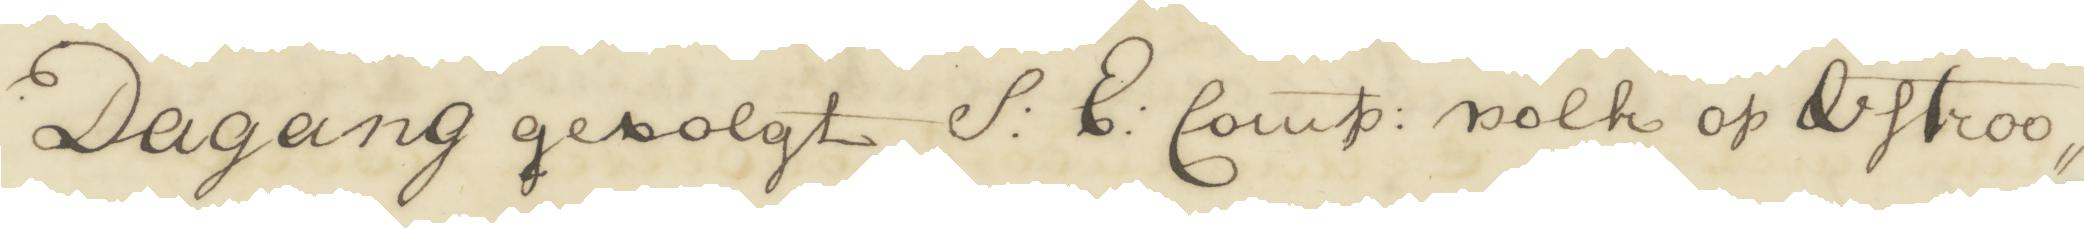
Dagang gevolgt S: E: Comp: volk op destroo„
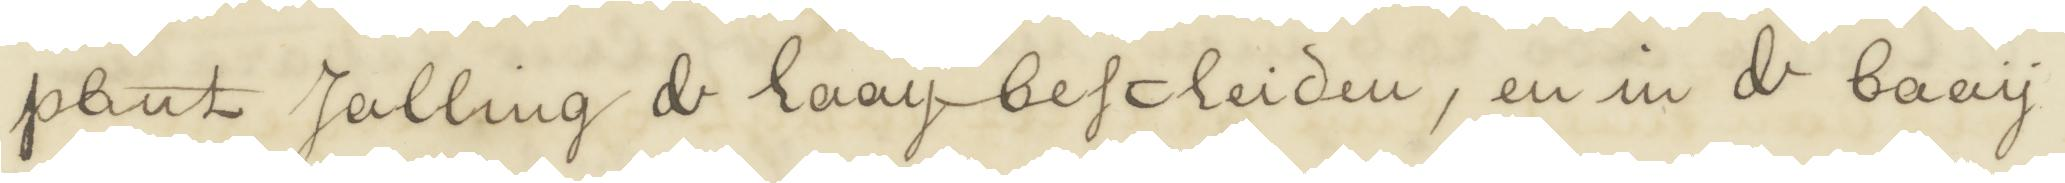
pant Jalling de haaij bescheiden, en in de baaij
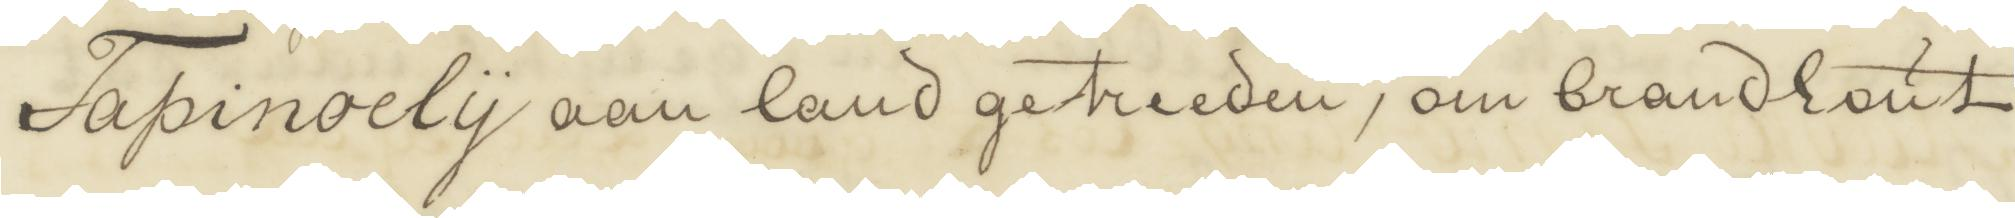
Tapinoelij aan land getreeden, om brandhout
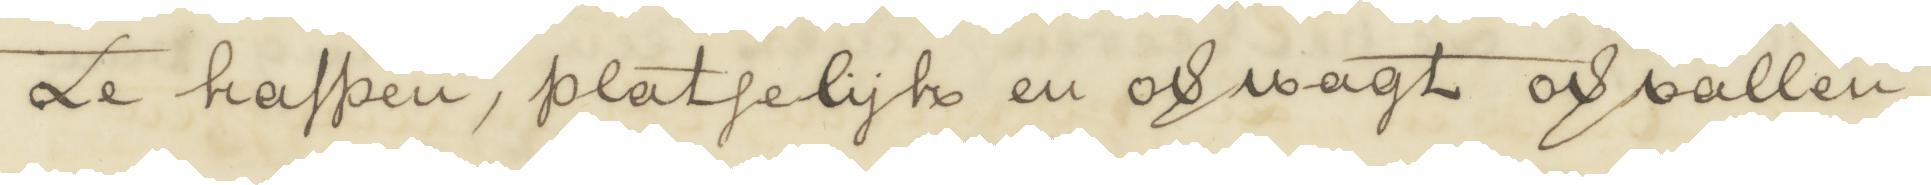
te kappen, plotselijk en overwagt overvallen,
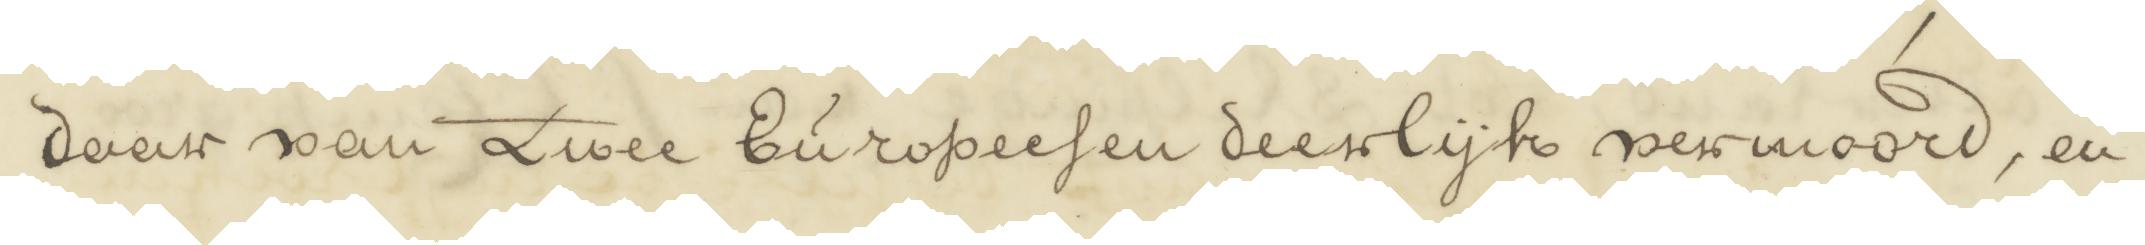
daar van twee Europeesen deerlijk vermoord, en
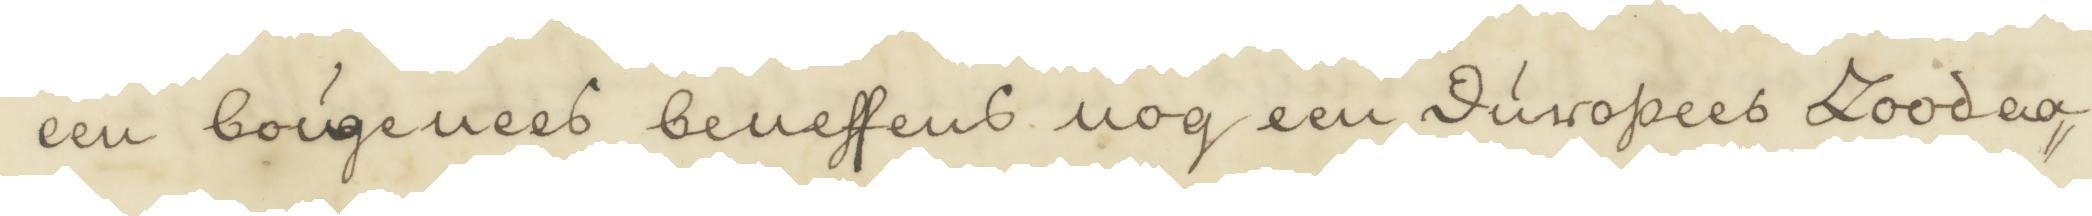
een bougenees beneffens nog een Europees zoodaa„
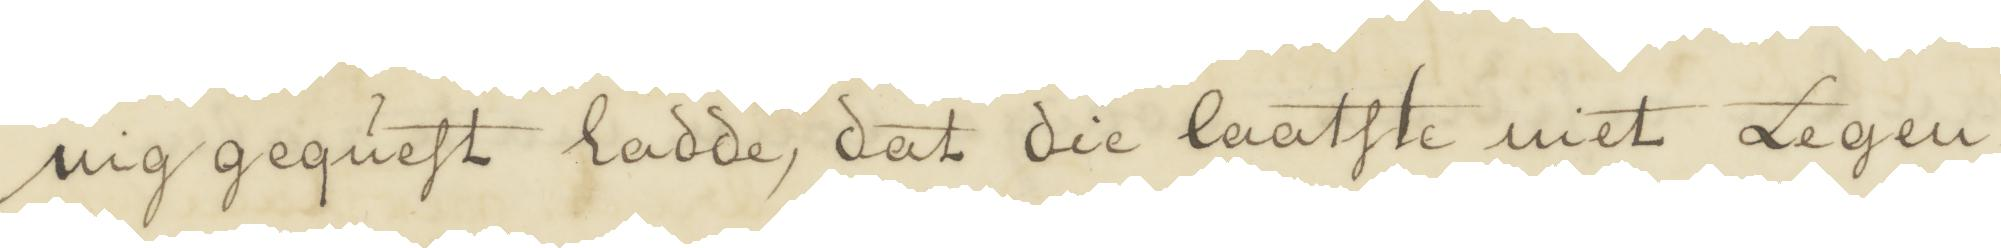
nig gequest hadde, dat die laatste niet tegen
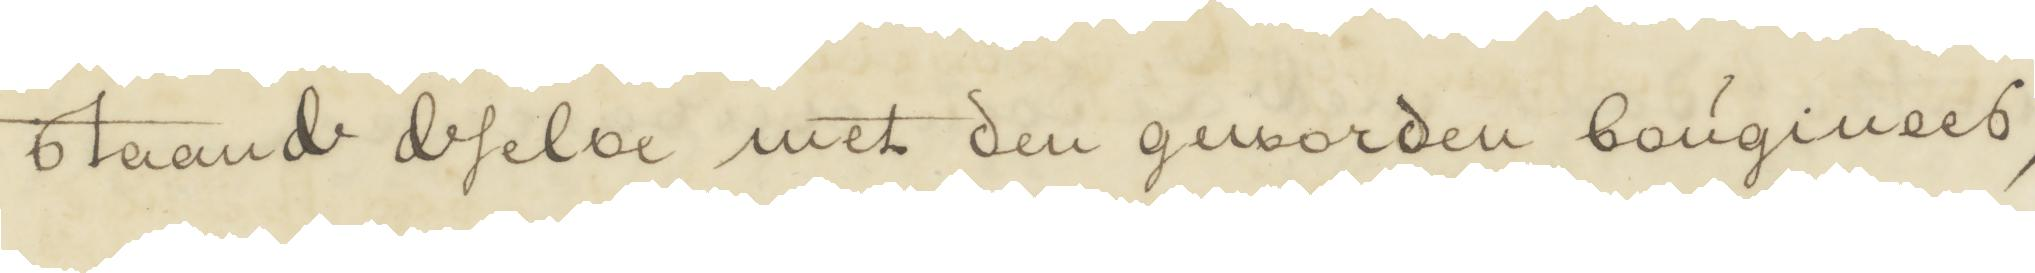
staande deselve met den geworden bouginees,
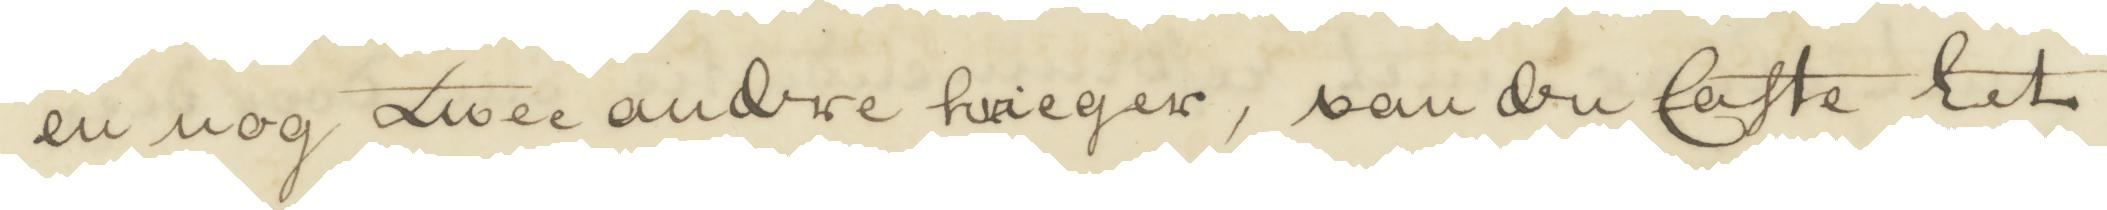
en nog twee andere krieger, van den Caste het
